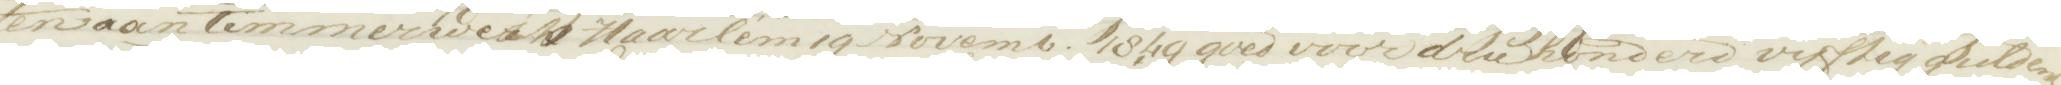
ten aan timmerwerk Haarlem 19 Novemb. 1849 goed voor driehonderd vyftig gulden
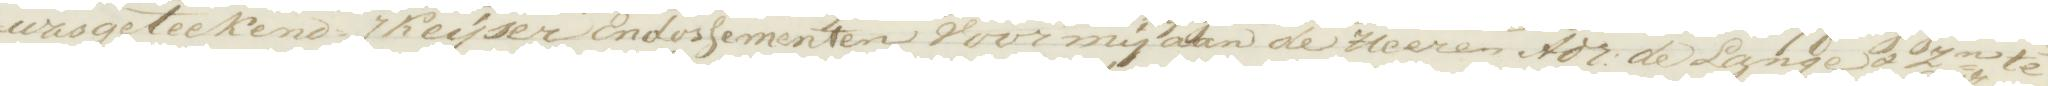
= was geteekend = J Keijser Endossementen Voor mij aan de Heeren Adr: de Lange & Z=n te
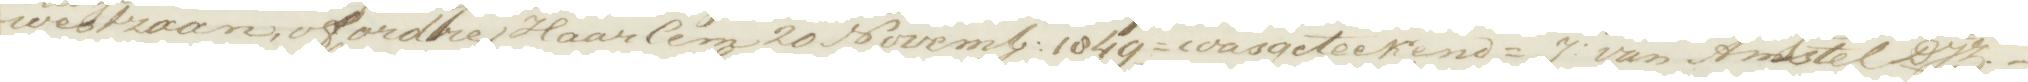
westzaan, of ordre Haarlem 20 Novemb: 1849 = was geteekend = J: van Amstel DJZ. —
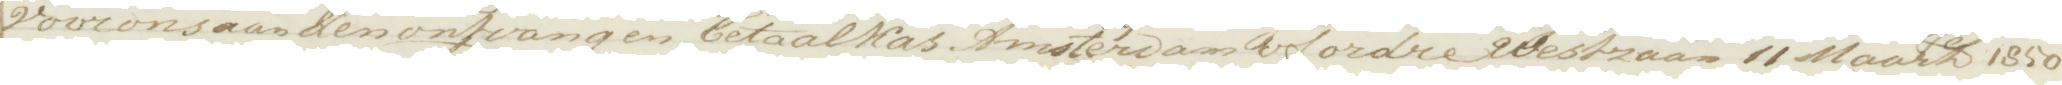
voor ons aan den ontvangen betaalkas. Amsterdam of ordre Westzaan 11 Maart 1850
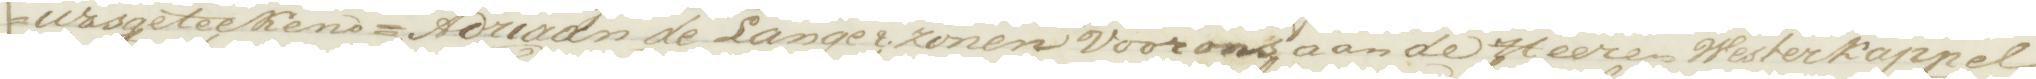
= was geteekend = Adriaan de Lange & zonen voor ons aan de Heeren Westerkappel
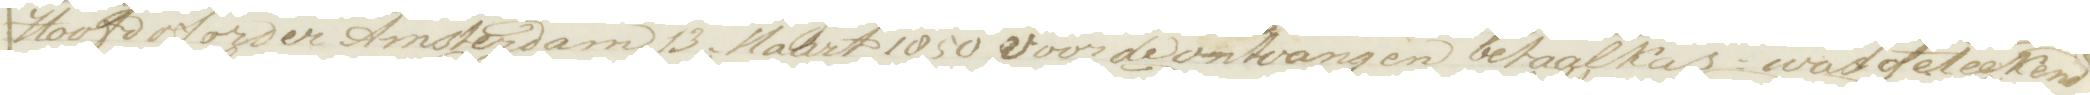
Hoofd of order Amsterdam 13. Maart 1850 voor de ontvangen betaalkas = was geteekend
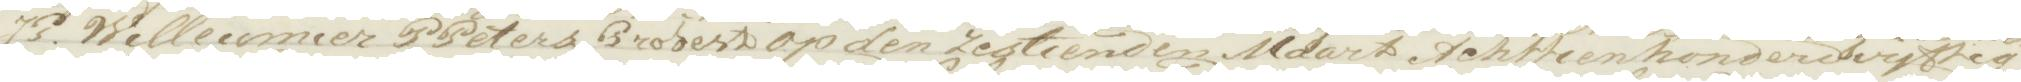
B. Willeumier P Peters Protest op den zestienden Maart Achttienhonderd vijftig
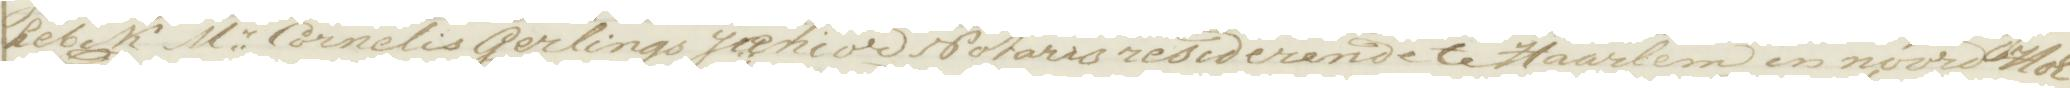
heb ik M„r Cornelis Gerlings Junior Notaris residerende te Haarlem in noord Hol
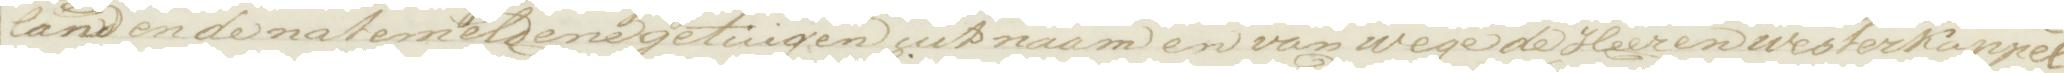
land en de natemeldene getuigen uit naam en van wege de Heeren westerkappel
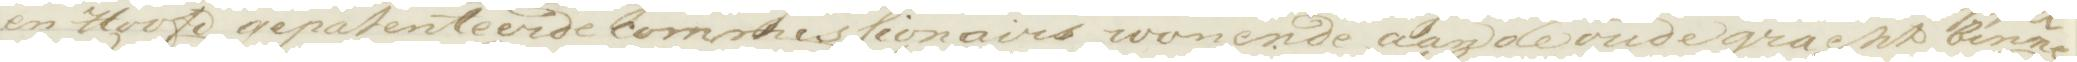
en Hoofd gepatenteerde commissionairs woonende aan de oude gracht binnen
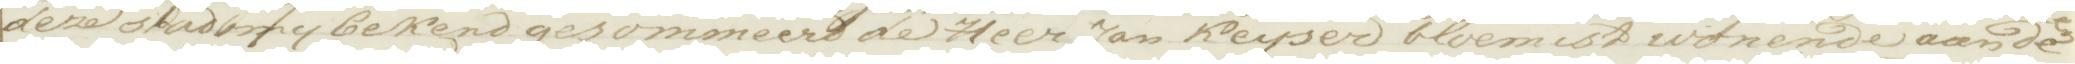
deze stad my bekend gesommeerd de Heer Jan Keijser bloemist wonende aan de
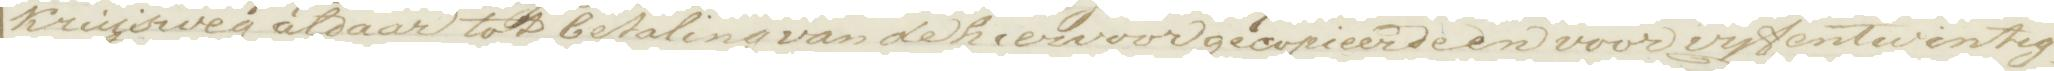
Kruisweg aldaar tot betaling van de hiervoor gecopieerde en voor vyfentwintig
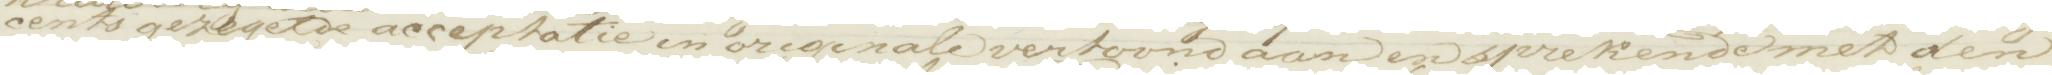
cents gezegelde acceptatie in originale vertoond aan en sprekende met den
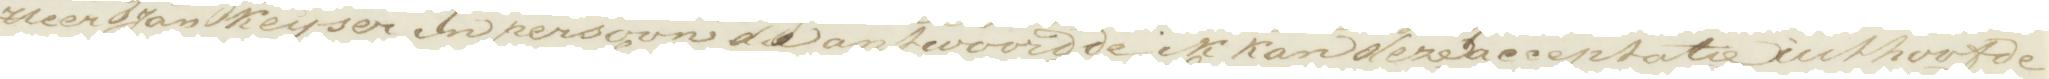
Heer Jan Keijser in persoon die antwoordde ik kan deze acceptatie uithoofde
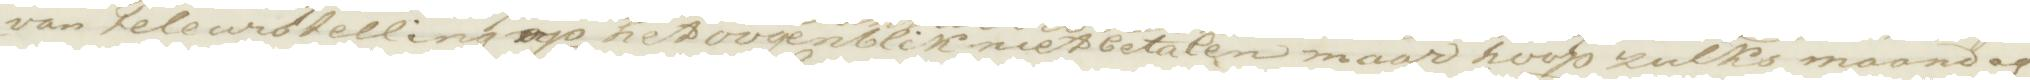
van teleurstelling op het oogenblik niet betalen maar hoop zulks maandag
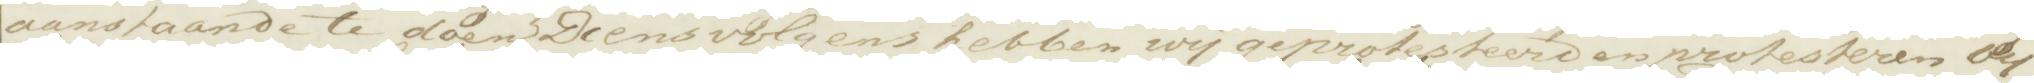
aanstaande te doen Diensvolgens hebben wy geprotesteerd en protesteren bij
